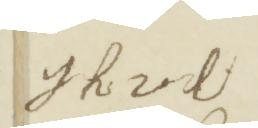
yhvl
